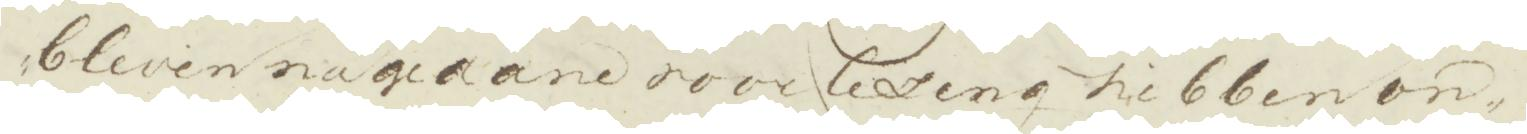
„bleven na gedane voorlezing hebben on„
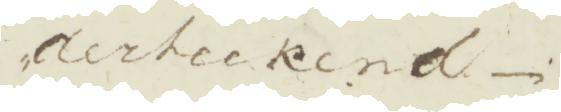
„derteekend
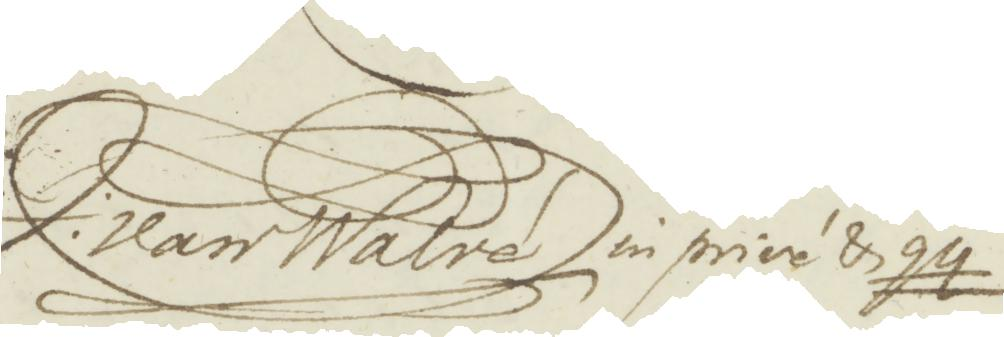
J: van Walre in privé & qq
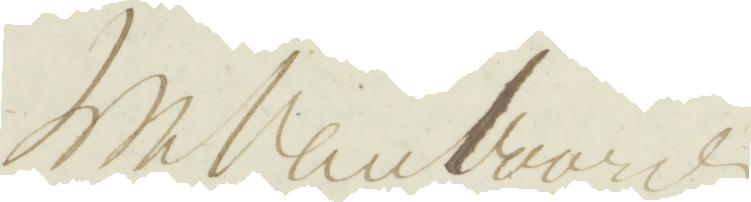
W Van booren
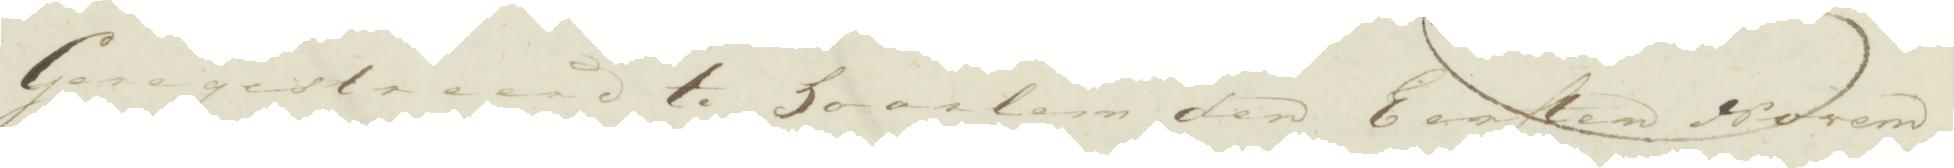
Geregistreerd te Haarlem den Eersten Novem
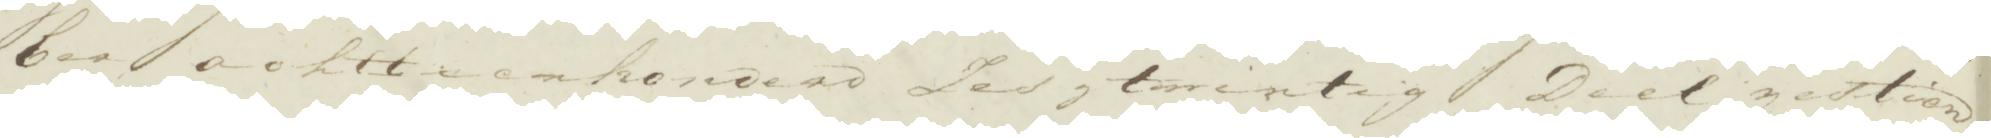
ber achttien honderd zes en twintig Deel zestien
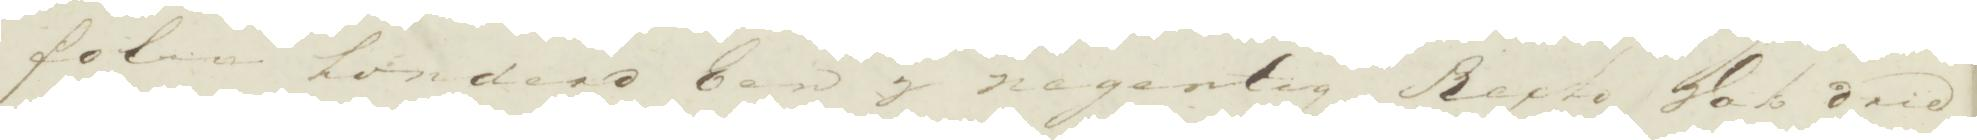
folio honderd Een en negentig Recto Vak drie
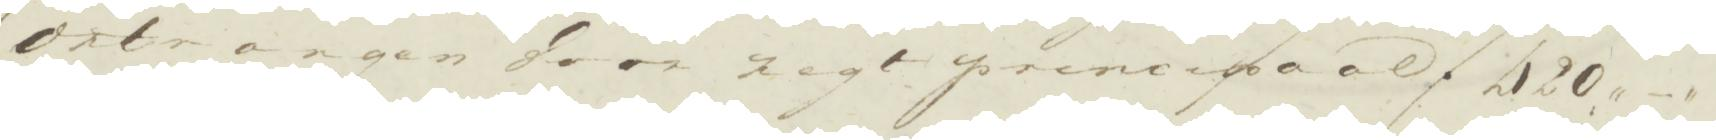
ontvangen voor regt principaal ƒ 420„ – „
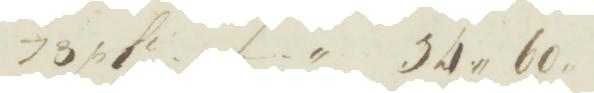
13 pct . . . . . „ 54.„ 60„
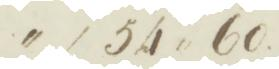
13 pct . . . . . „ 54 „ 60.
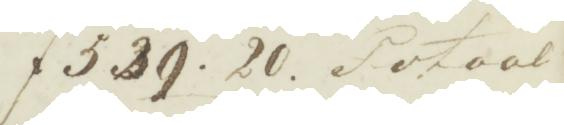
ƒ 539. 20. Totaal
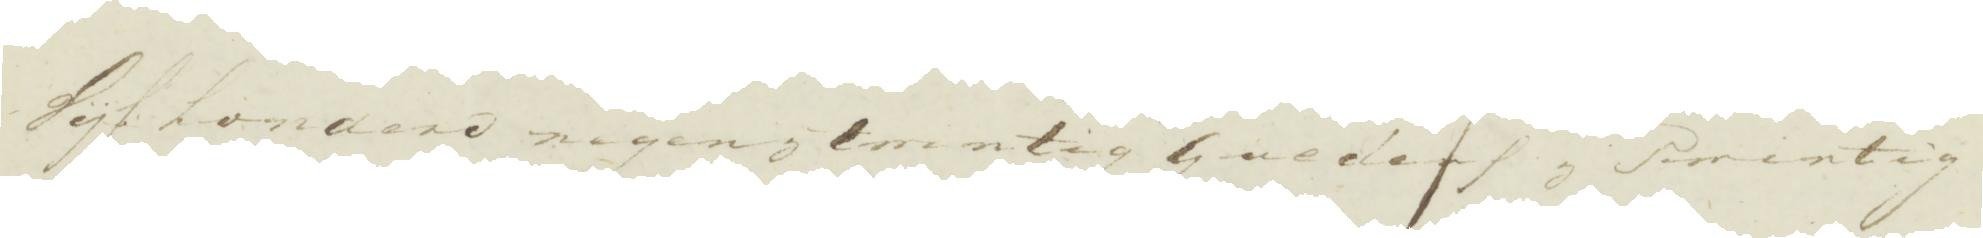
Vijf honderd negen en twintig Guldens en Twintig
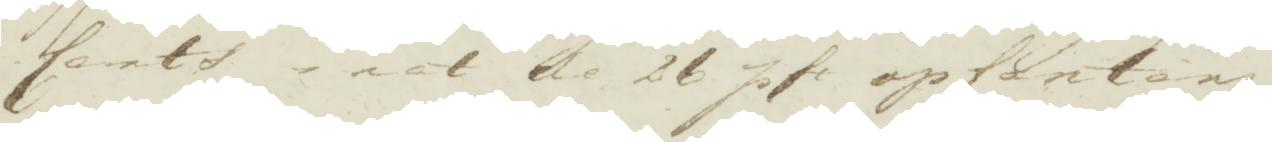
Cents mat de 26 pct opcenten.
